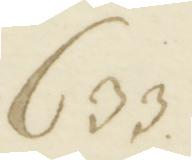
635.
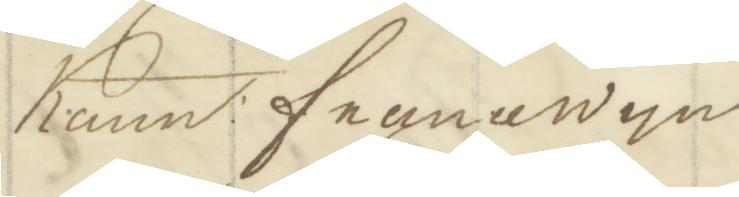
Kann: francewijn
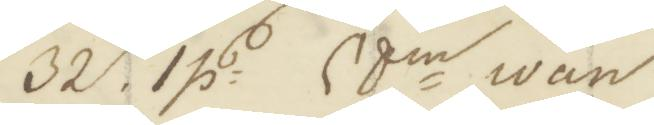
32: 1p=s 5d=m wan
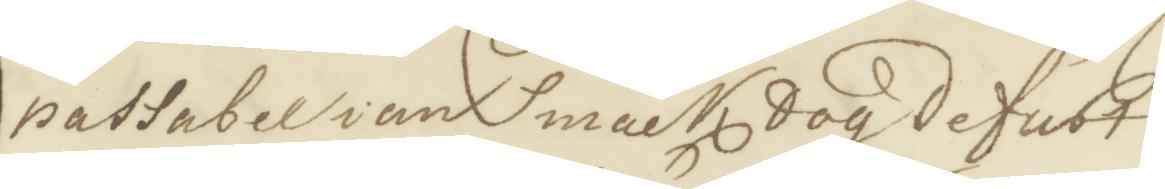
passabel van Smaek dog de fust
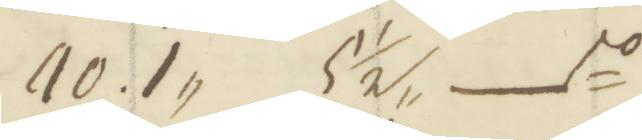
40: 1„ 5½„ _=o
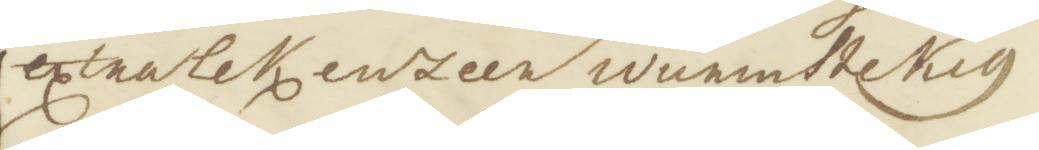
extra lek en zeer wurmstekig
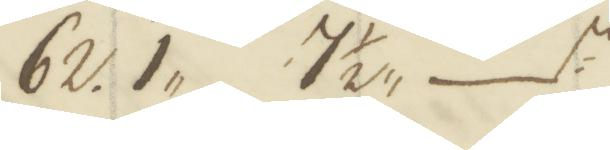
62. 1„ 7½„ _=o
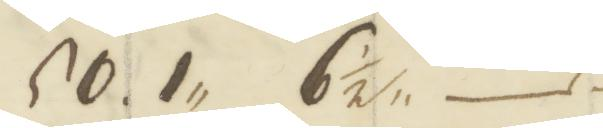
50. 1„ 6½„ _=o
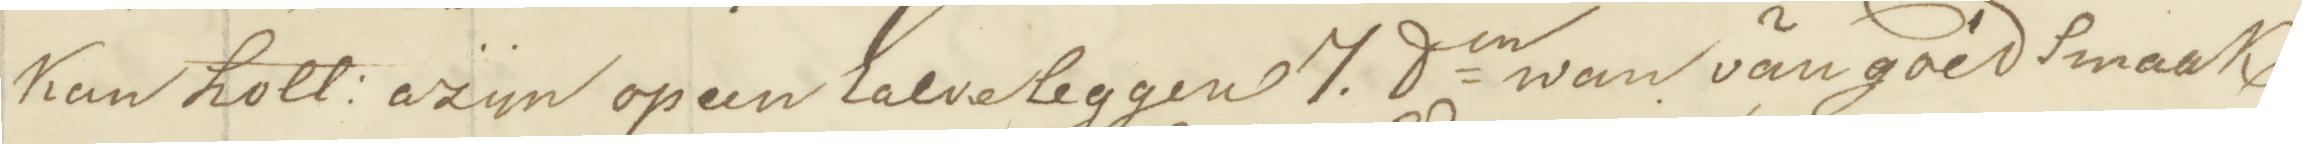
kan holl: azijn op een halve leggen 7. d=m wan van goed smaak
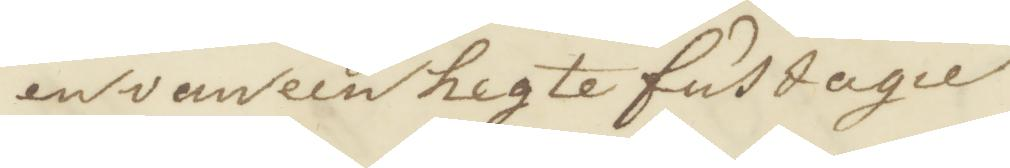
en van een hegte fustagie
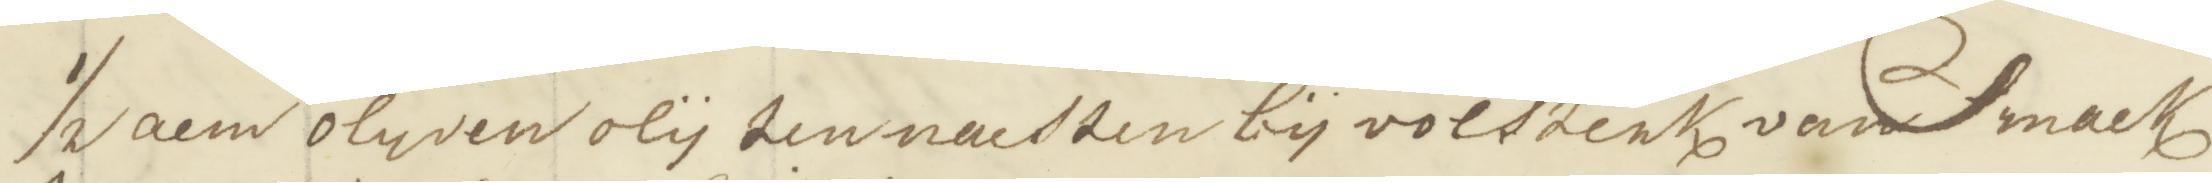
½ aem olijven olij ten naesten bij volsterk van Smaek
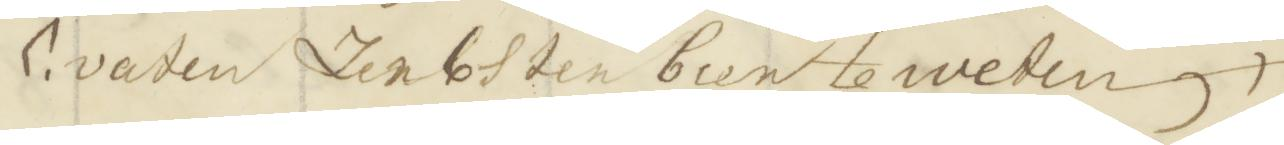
5. vaten zerbsten bier te weten
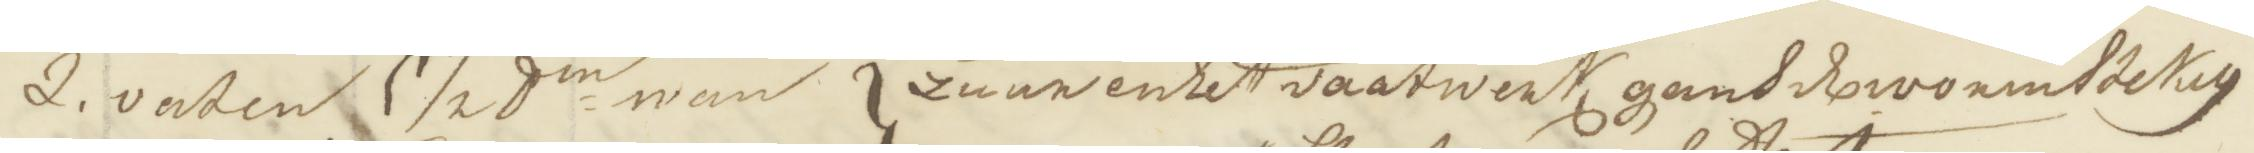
2. vaten 5½ d=m wan zuur en het vaatwerk gansch wormstekig
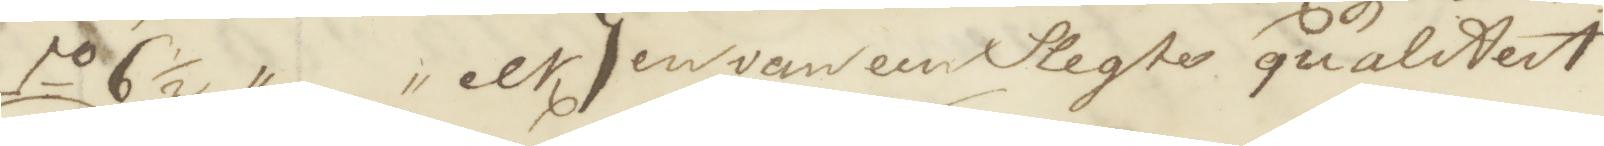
_=p 6½ „ „ elk en van een slegte qualiteit
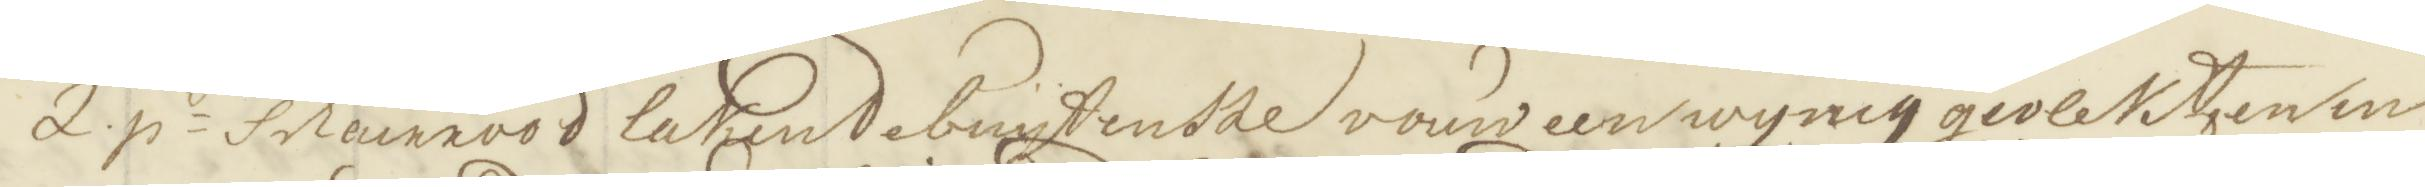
2. p=s schairrood laken de buijtenste vouw een wijnig gevlekt en in
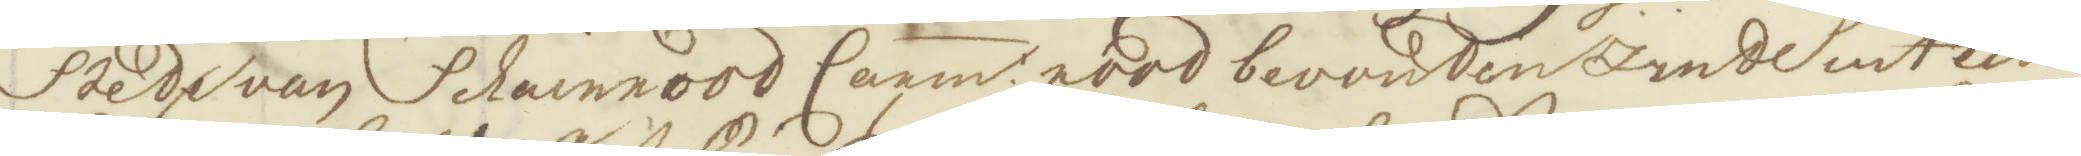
stede van Schairrood Carm: rood bevonden zijnde uit een
